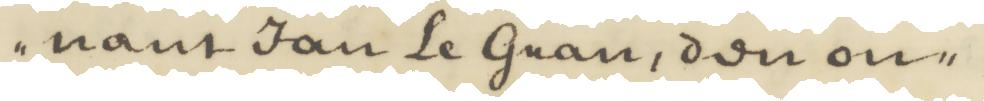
„nant Jan le Gran, den on„
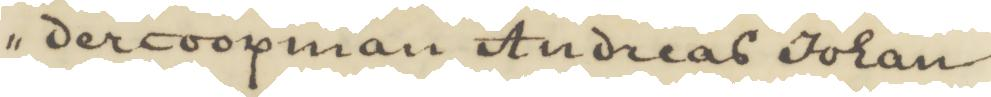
„dercoopman Andreas Johan
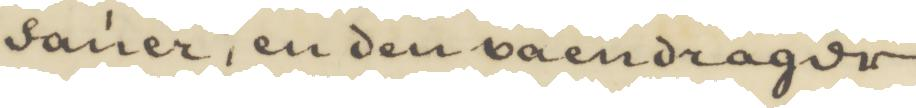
Sauer, en den vaendrager
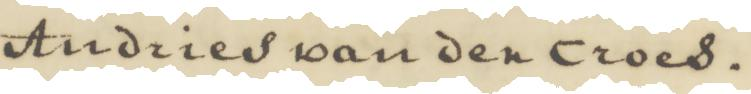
Andries van der Croes.
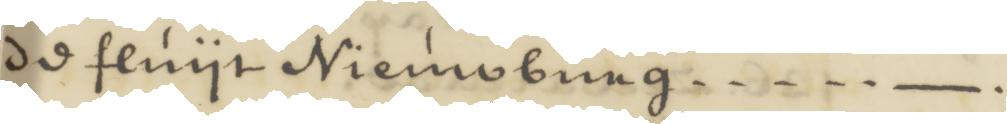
de fluijt Nieuwburg - - - - - — .
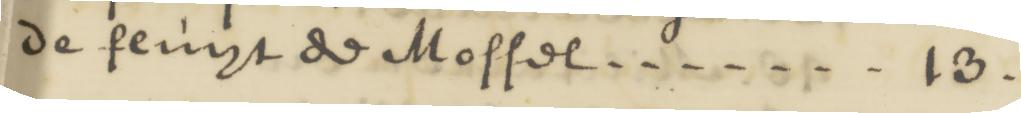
de fluijt de Mossel - - - - - - - 13.
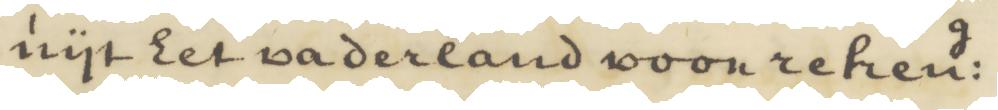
uijt het vaderland voor reken:g
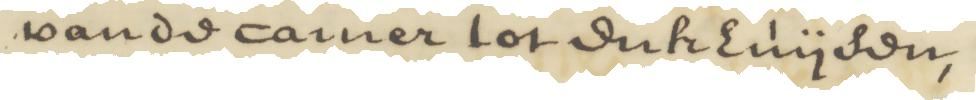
van de camer tot enkhuijsen,
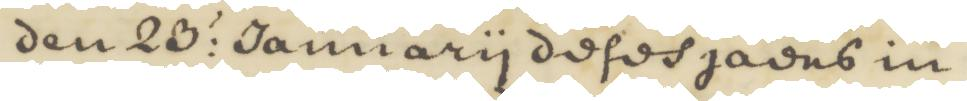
den 23':en Januarij deses jaers in
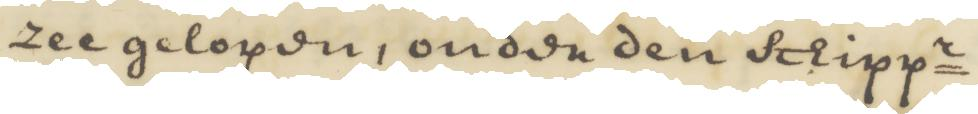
zee gelopen, onder den schipp=r
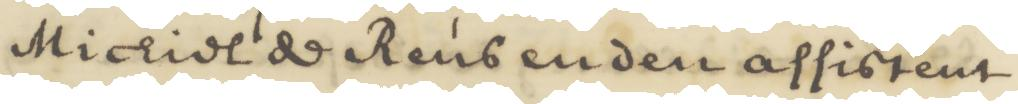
Michiel de Reus en den assistent
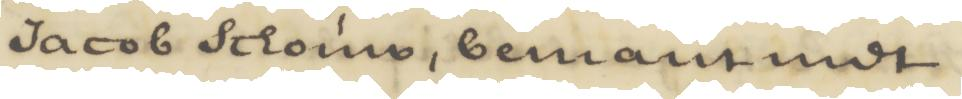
Jacob Schouw, bemant met
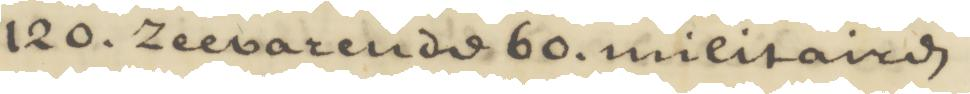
120. zeevarende 60. militairen
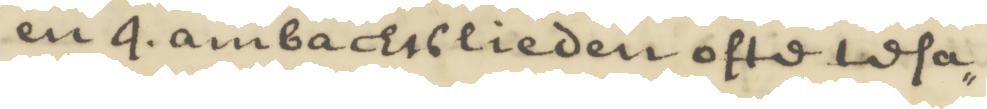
en 4. ambachtslieden ofte tesa„
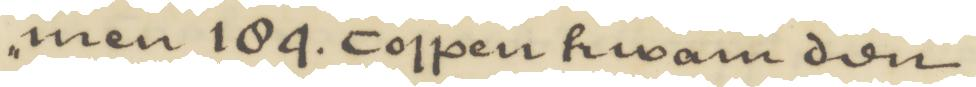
„men 184. coppen kwam den
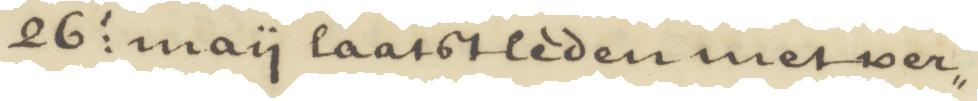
26': maij laatstleden met ver„
